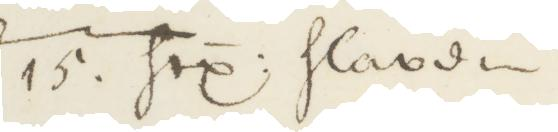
15. stx: slaven
